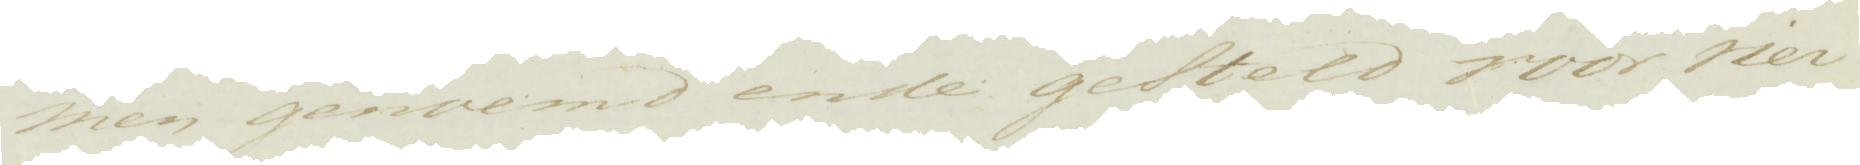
men genoemd ende gesteld voor vier
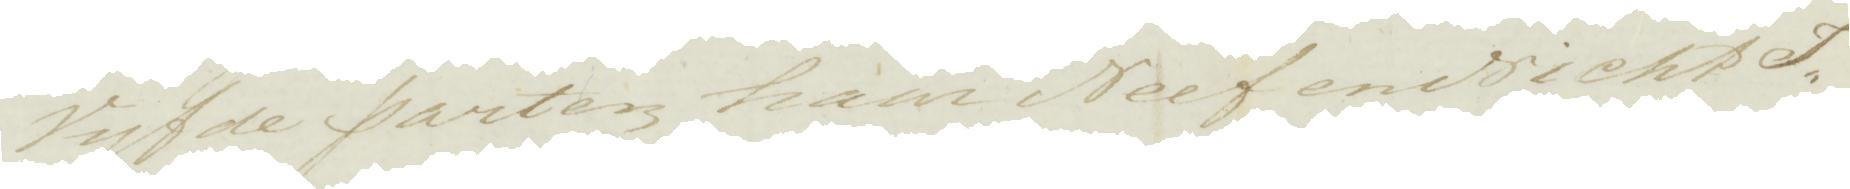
Vyfde parten haar Neef en Nicht I„
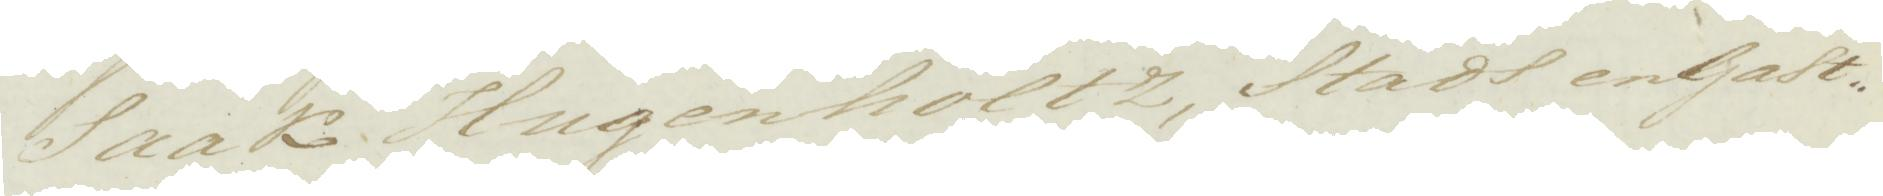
Saak Hugenholtz, stads en Gast„
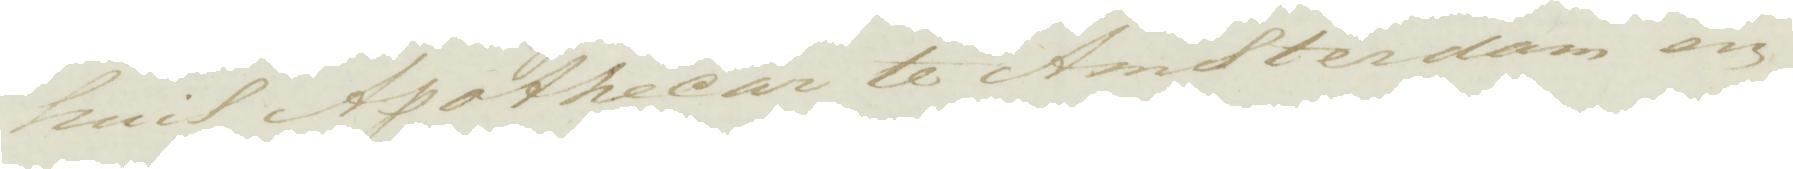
huis Apothecar te Amsterdam en
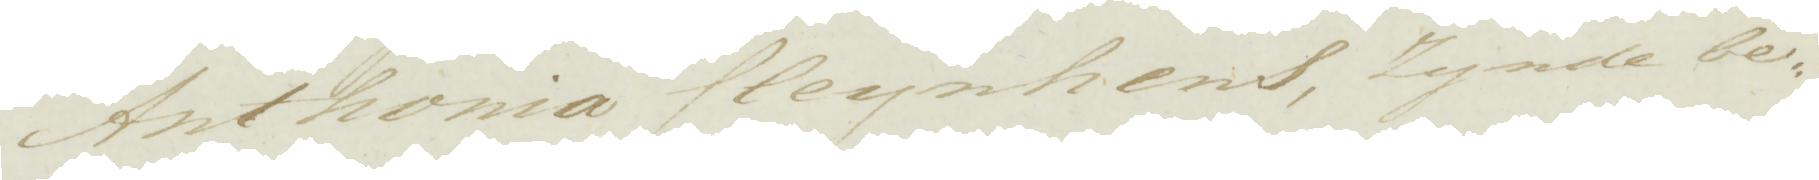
Anthonia Cleynhens, zynde be„
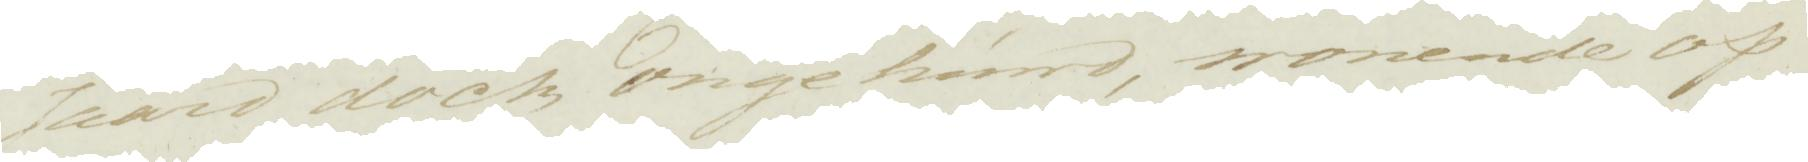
Jaard doch ongehuwd, wonende op
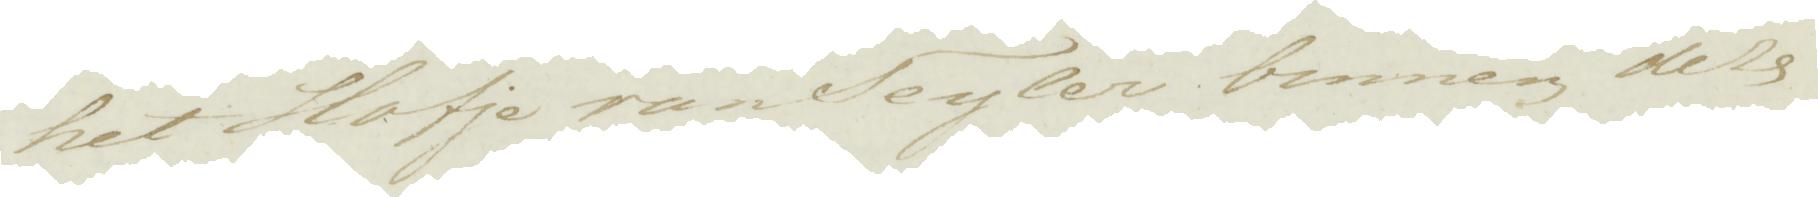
het Hofje van Teyler binnen deze
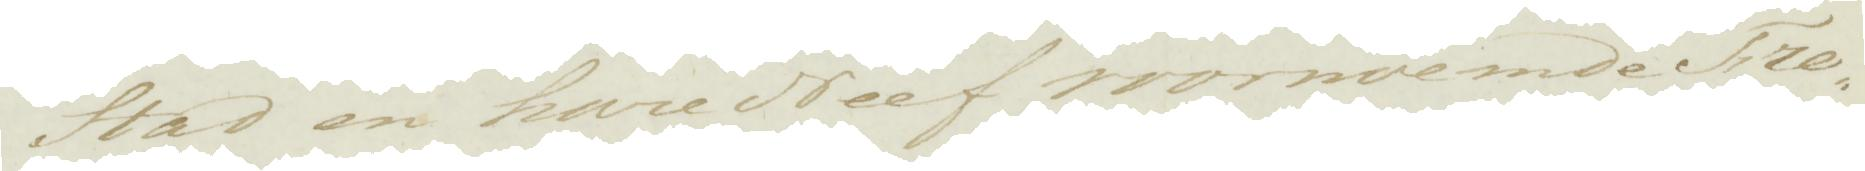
stad en hare Neef voornoemde Fre„
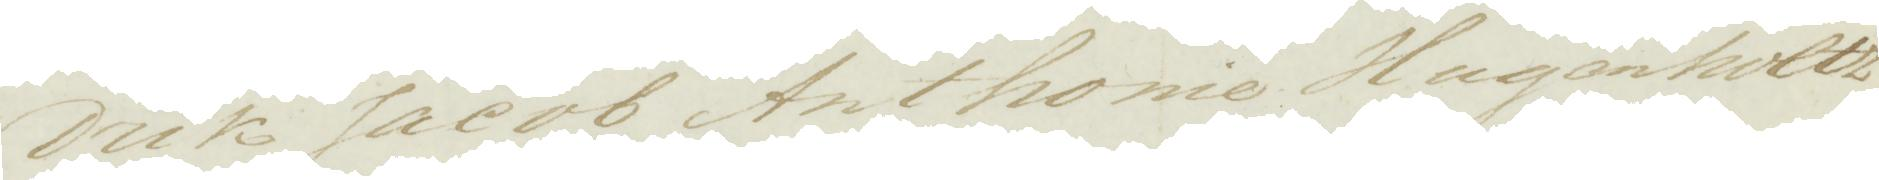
drik Jacob Anthonie Hugenholtz,
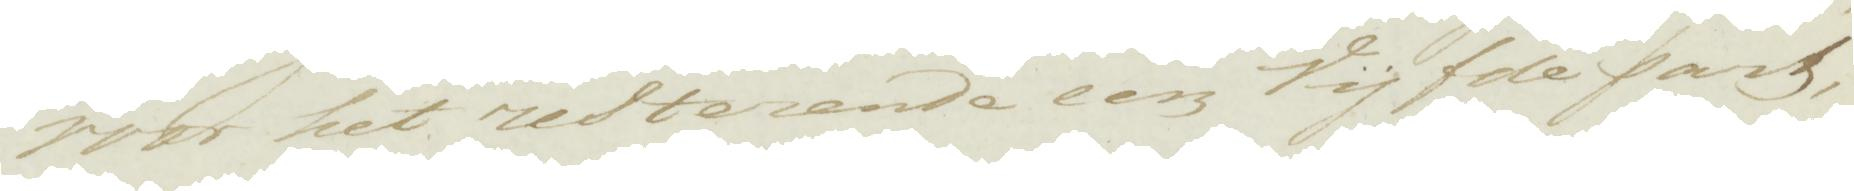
voor het resterende een Vijfde part,
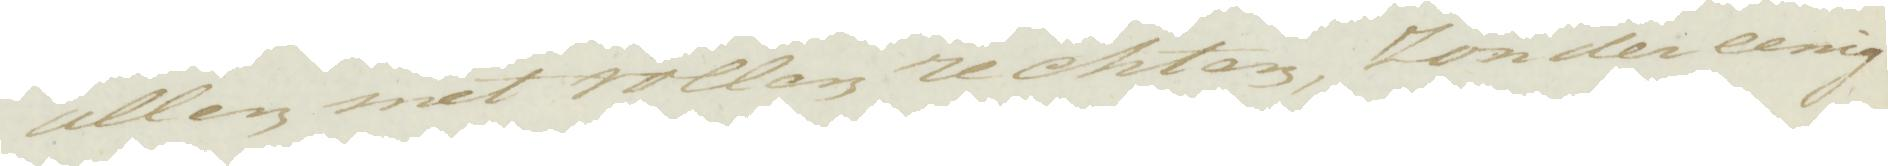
allen met vollen rechten, zonder eenig
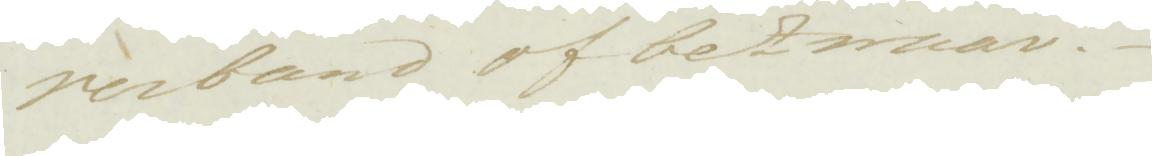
verband of bezwaar. –
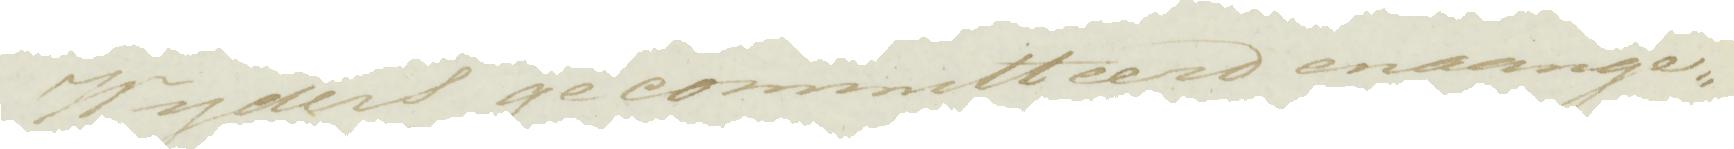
Wyders gecommitteerd en aange„
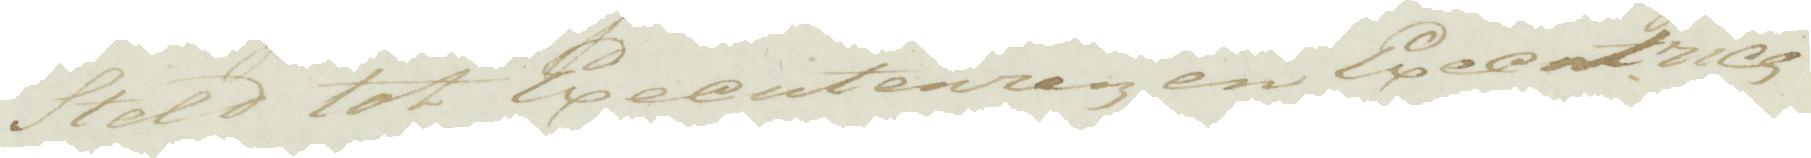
steld tot Executeuren en Executrice
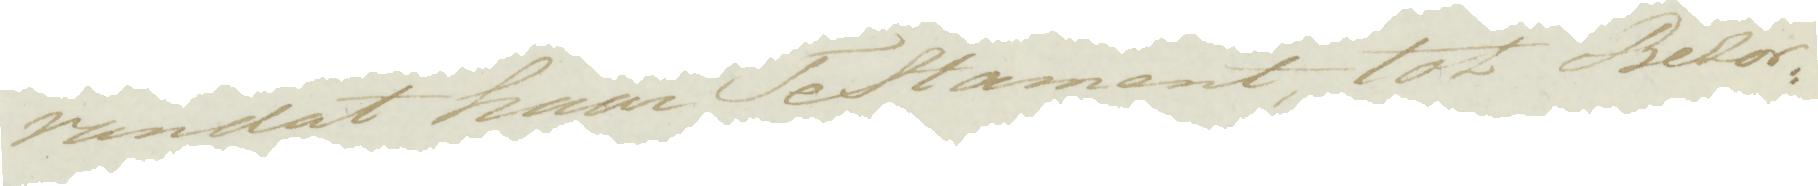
van dat haar Testament, tot Bezor„
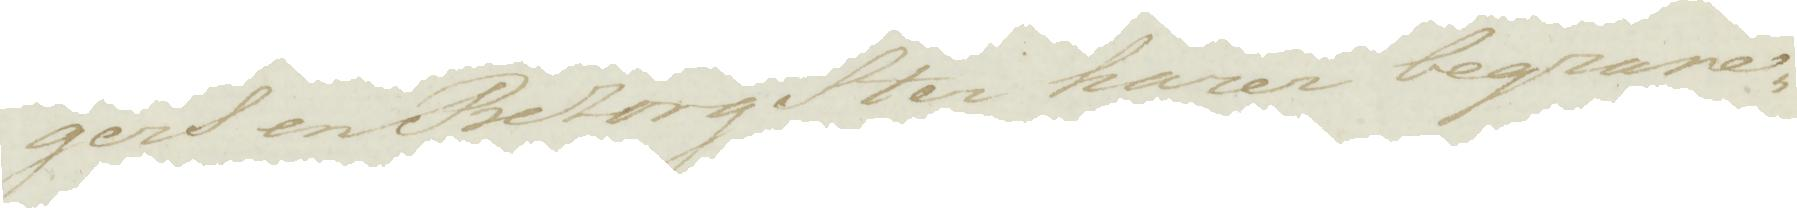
gers en Bezorgster harer begrave„
